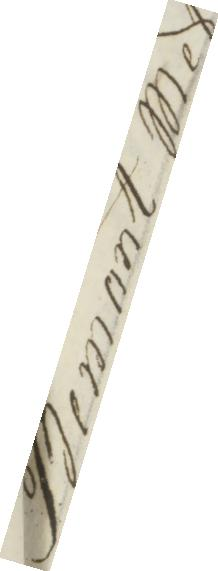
Bemant met
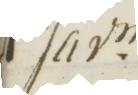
4 Jav=n
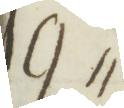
19 „
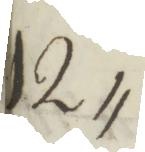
12 „
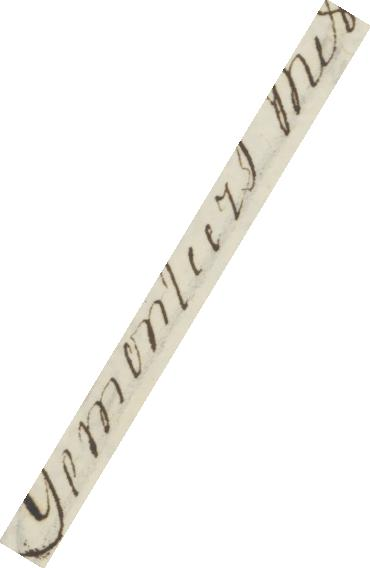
Gemonteert met
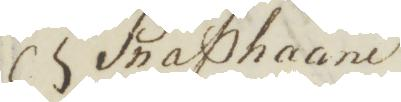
5 Snaphaane
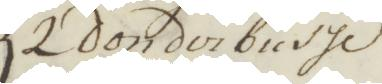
2 donderbusse
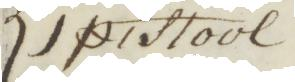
1 pistool
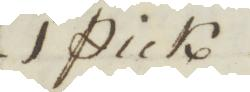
1 piek
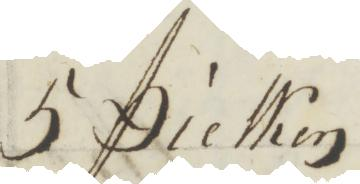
5 Piekken
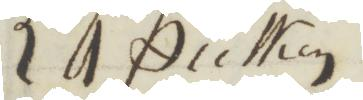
4 Piekken
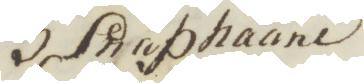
3 Snaphaane
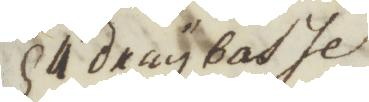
4 draijbasse
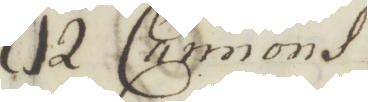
12 Carmons
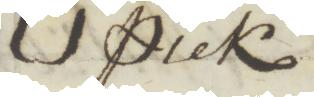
1 Piek
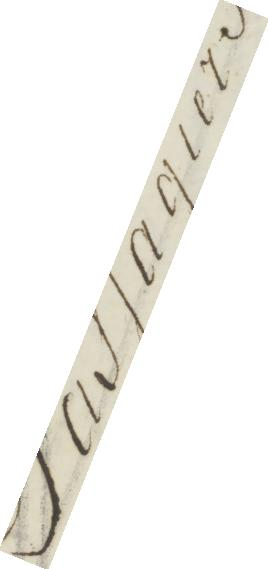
Passagiers
